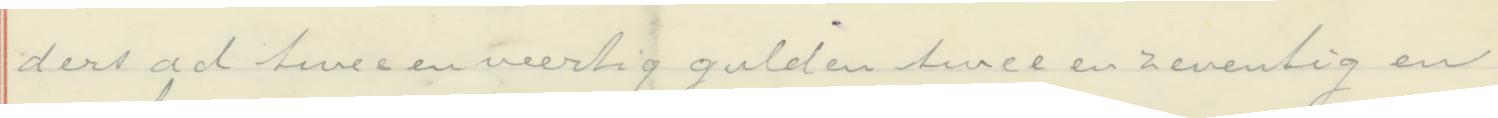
dert ad twee en veertig gulden wel en zeventig en
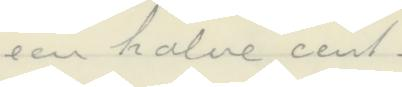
een halve cent
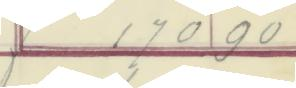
ƒ 170 90
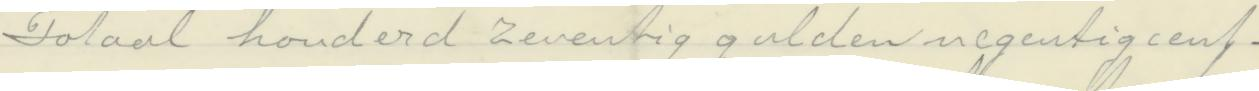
Totaal honderd zeventig gulden negentig cent
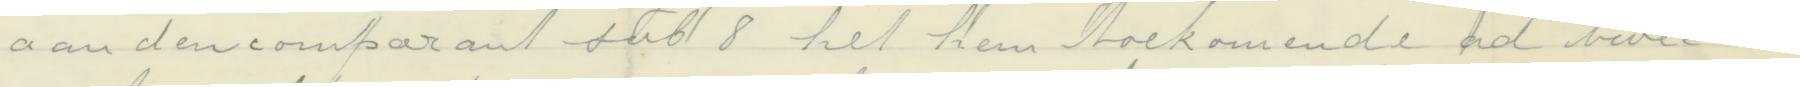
aan den comparant subs 8 het hem toekomende ad twee en
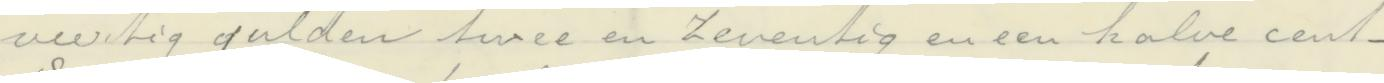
veertig gulden twee en zeventig en een halve cent
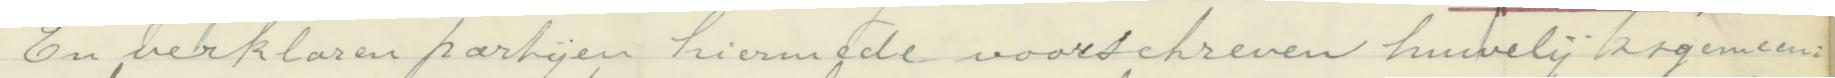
En verklaren partijen hiermede voorschreven huwelijksgemeen=
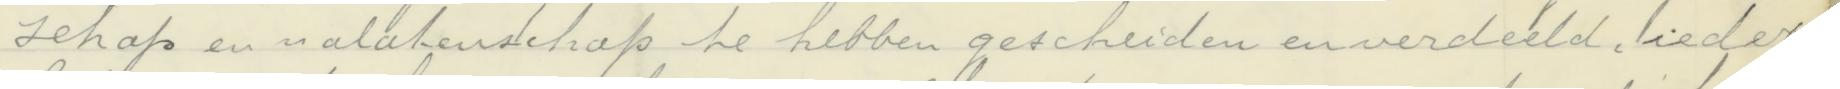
schap en nalatenschap te hebben gescheiden en verdeeld, ieder
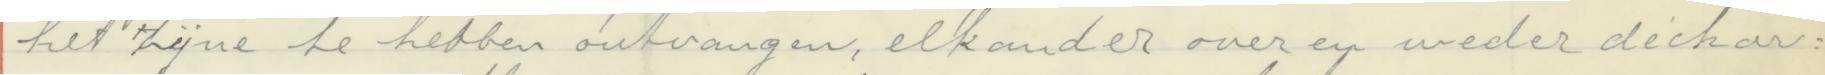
het zijne te hebben ontvangen, elkander over en weder dechar
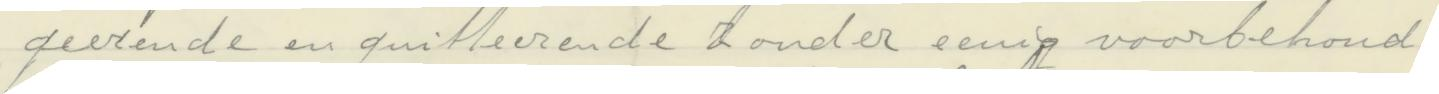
geerende en quitteerende zonder eenig voorbehoud
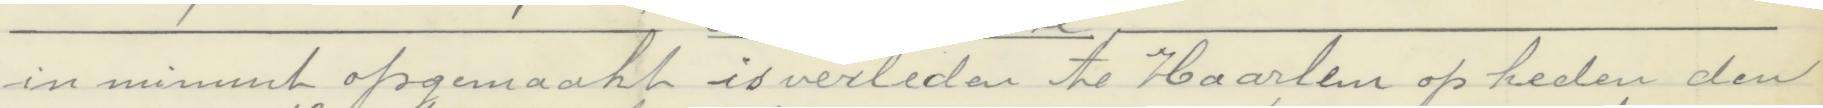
en minuut opgemaakt is verleden te Haarlem op heden den
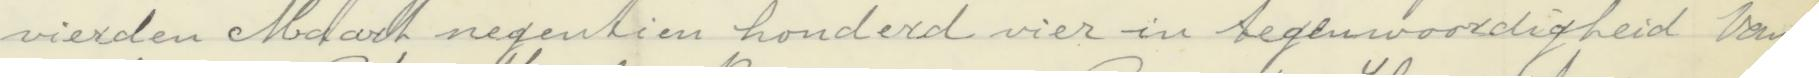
vierden Maart negentien honderd vier in tegenwoordigheid van
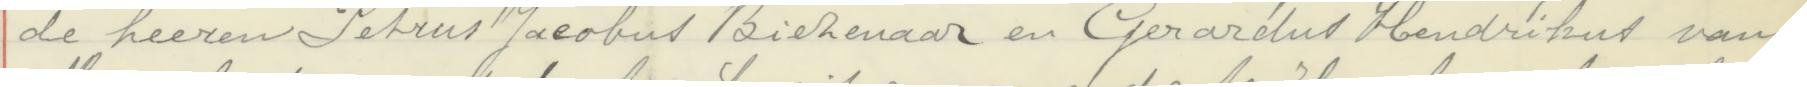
de heeren Petrus Jacobus Biezenaar en Gerardus Hendrikus van
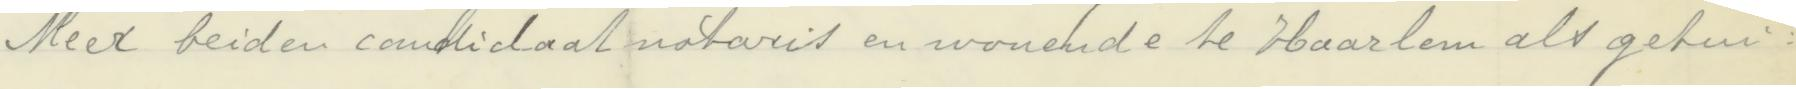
Meer beiden candidaat notaris en wonende te Haarlem als getui
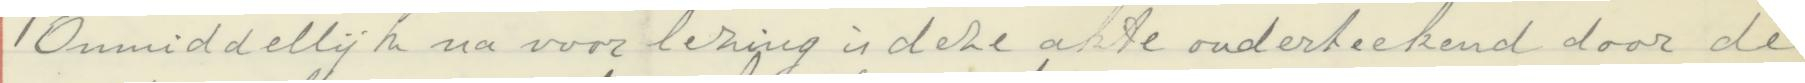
Onmiddellijk na voorlezing is deze akte onderteekend door de
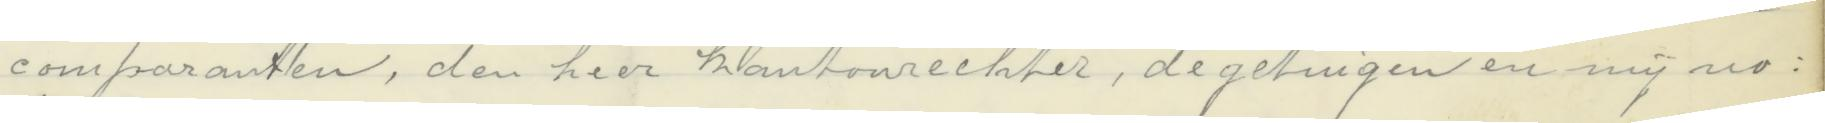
comparanten, den heer kantonrechter, de getuigen en mij no:
